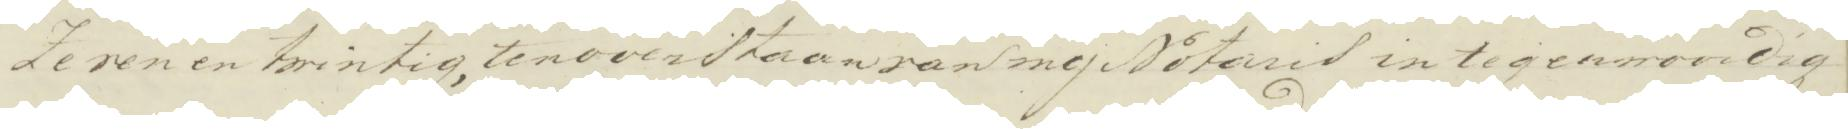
Zeven en twintig, ten overstaan van my Notaris in tegenwoordig
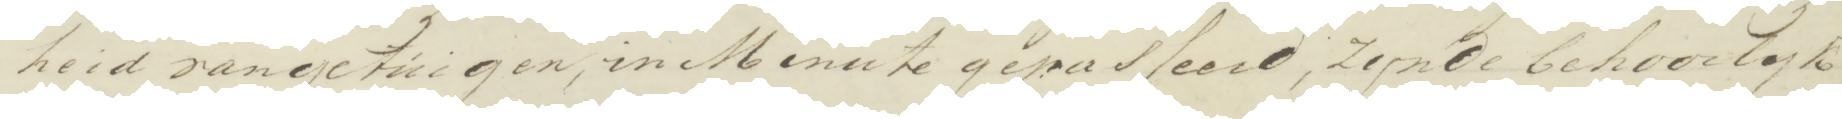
heid van getuigen, in Minute gepasseerd, zynde behoorlyk
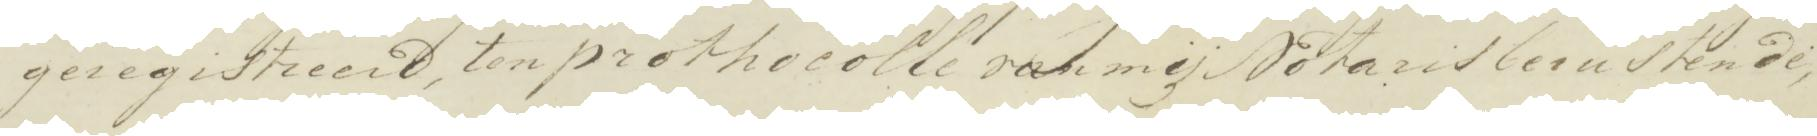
geregistreerd, ten prothocolle van mij Notaris berustende,
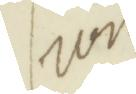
Crom
